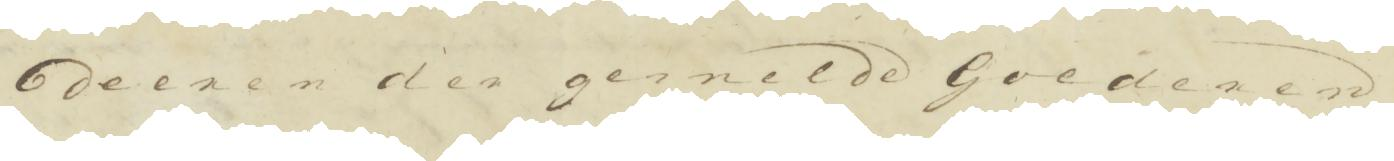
deeren der gemelde Goederen.
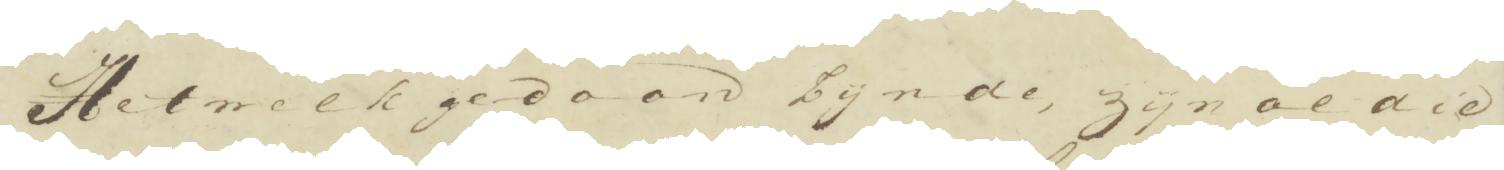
Het welk gedaan zijnde, zijn al die
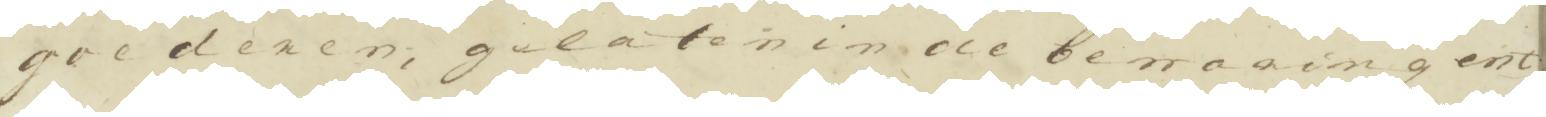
goederen, gelaten in de bewaring ent
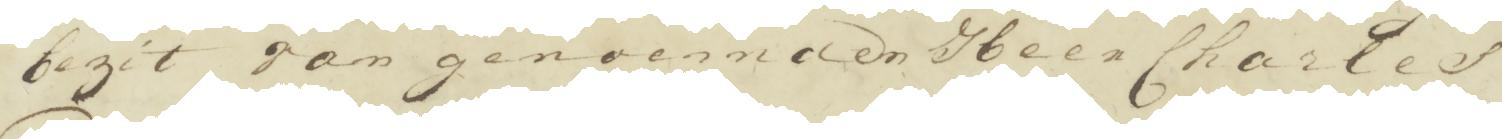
bezit van genoemden Heer Charles
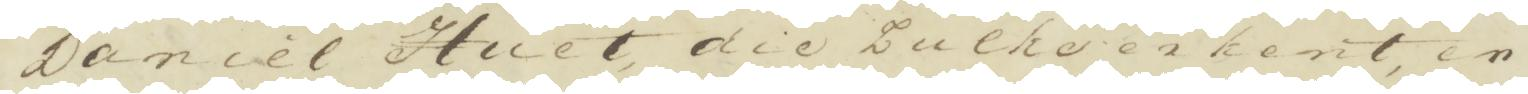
Daniel Huët, die zulks erkent, en
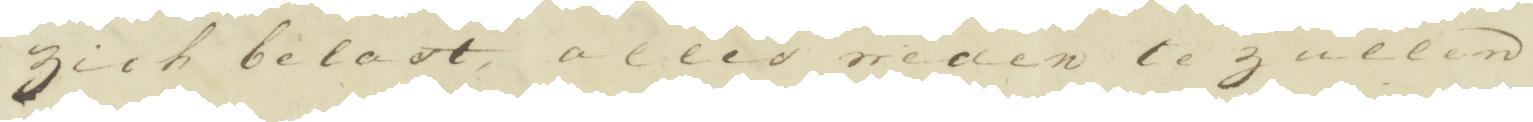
zich belast, alles weder te zullen
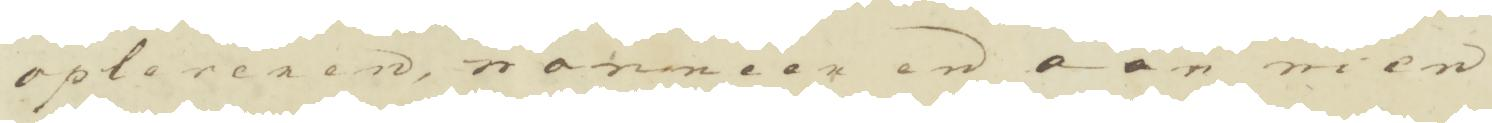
opleveren, wanneer en aan wien
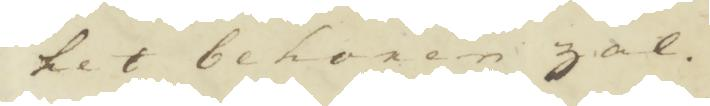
het behoren zal.
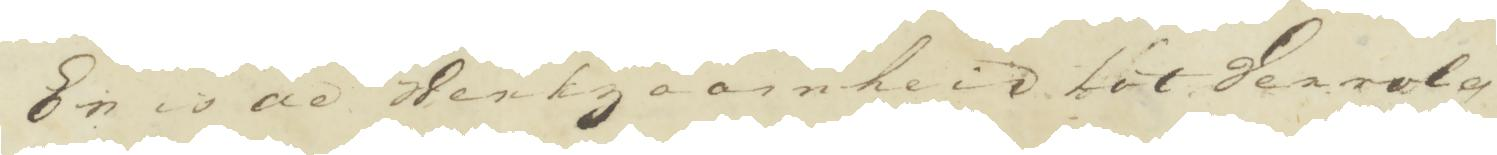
En is de werkzaamheid tot vervolg
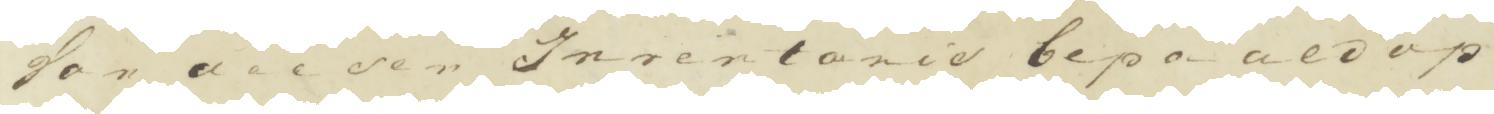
van deesen Jnventaris bepaald op
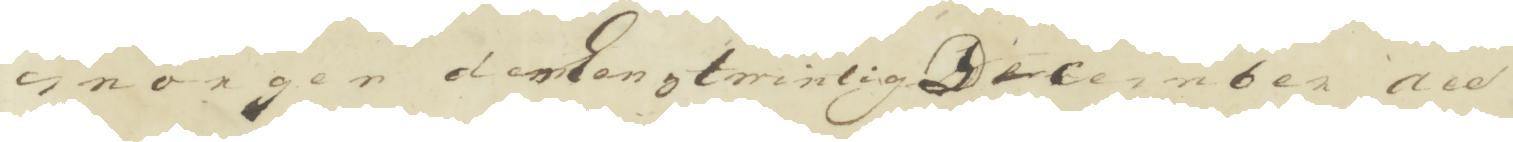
morgen de Een en twintig December des
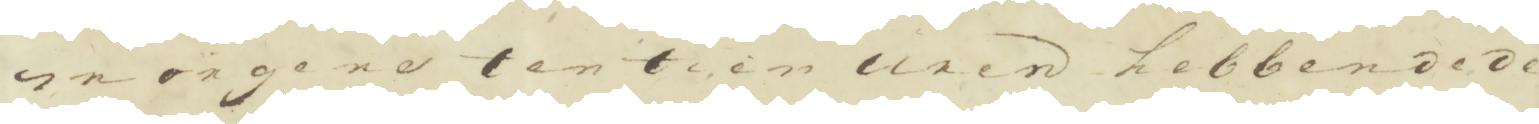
morgens ten tien uren hebbende de
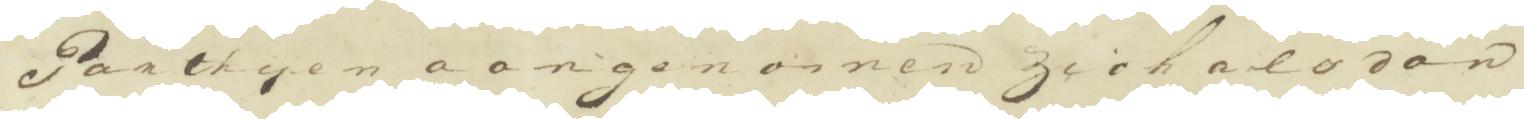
Parthyen aangenomen zich als dan
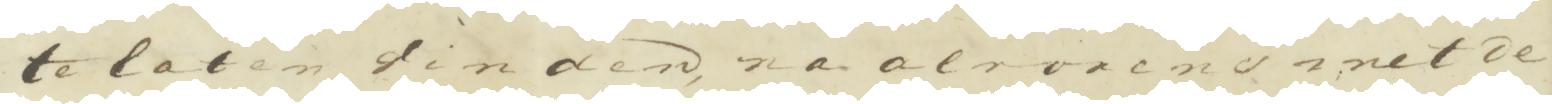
te laten vinden, na alvorens met de
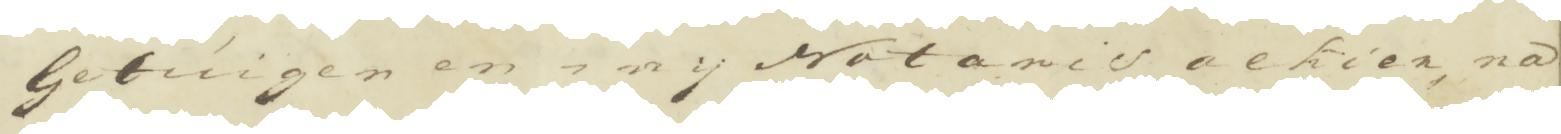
Getuigen en mij Notaris alhier, na
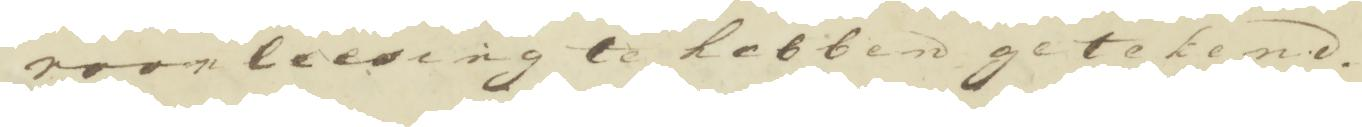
voorleesing te hebben getekend.
